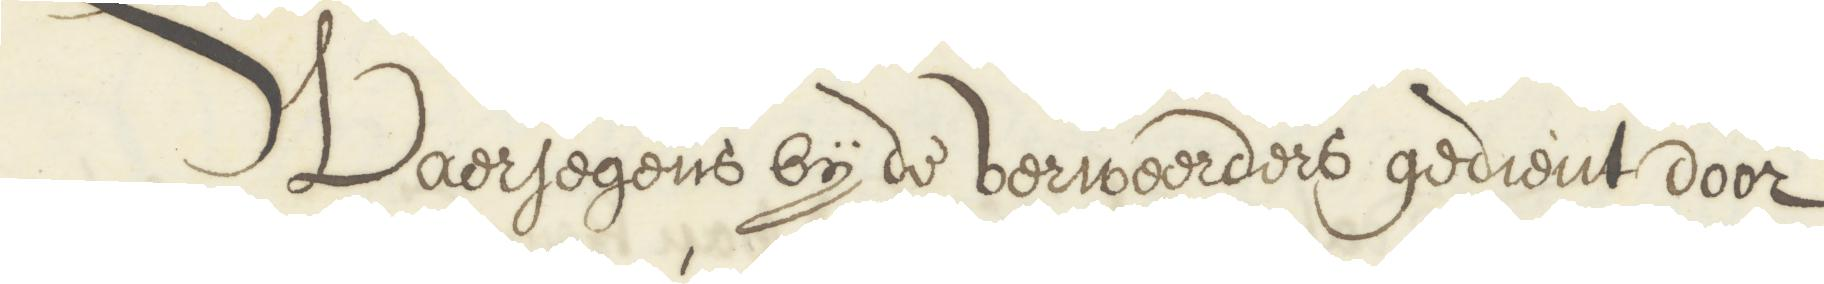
Waerjegens bij de verweerders gedient door
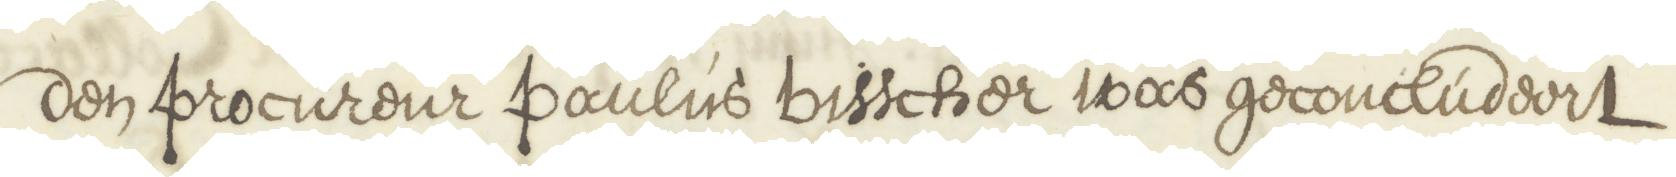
den procureur paulus visscher was geconcludeert
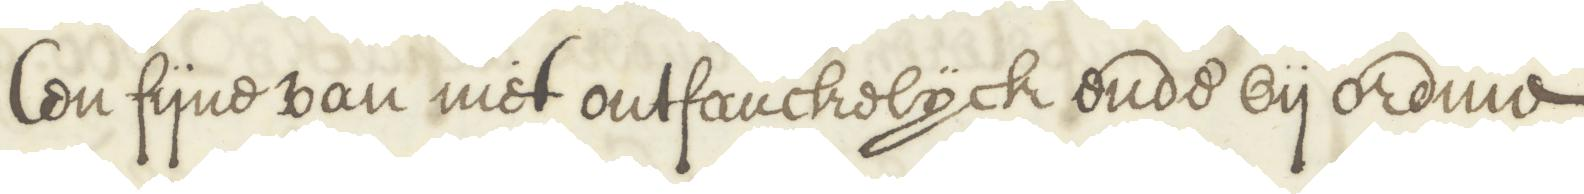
ten sijne van niet ontfanckelijck ende bij ordine
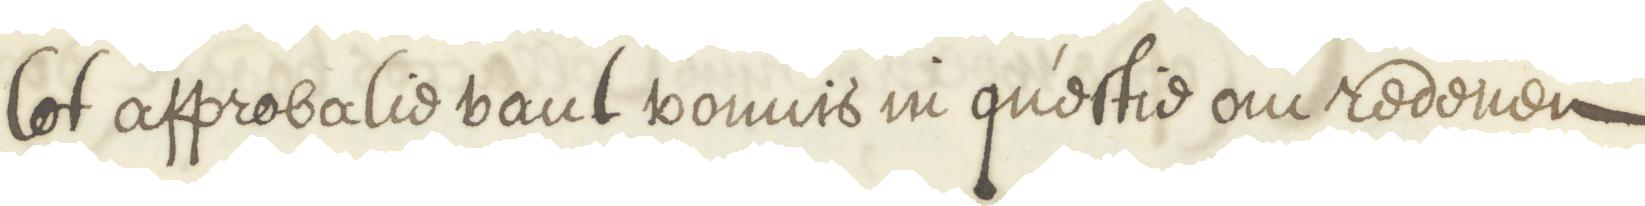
tot approbatie van t vonnis in questie om redenen
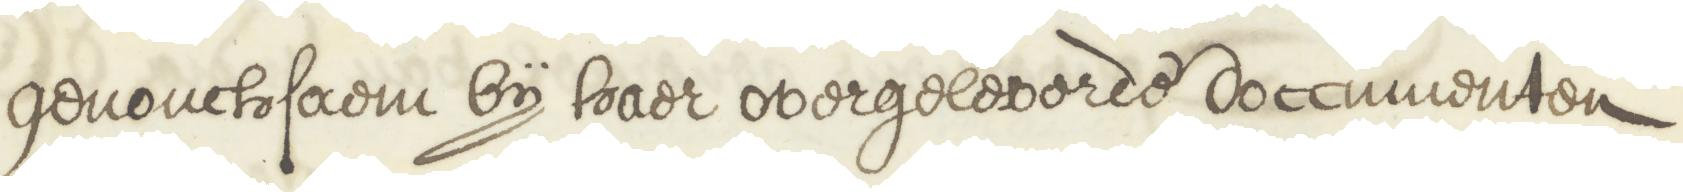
genouchsaem bij haer overgeleverde doccumenten
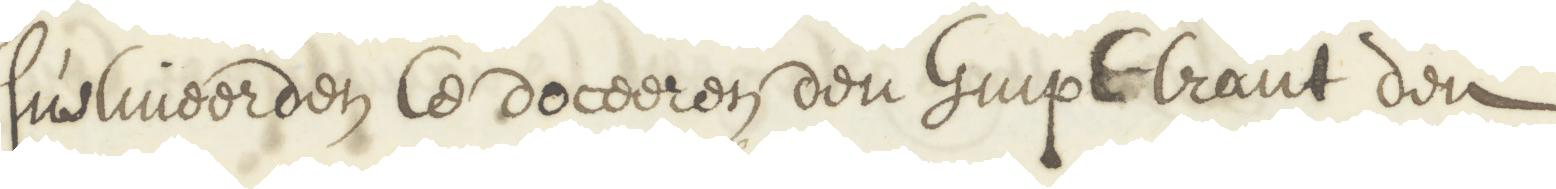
sustineerden te doceeren den Jmpetrant den
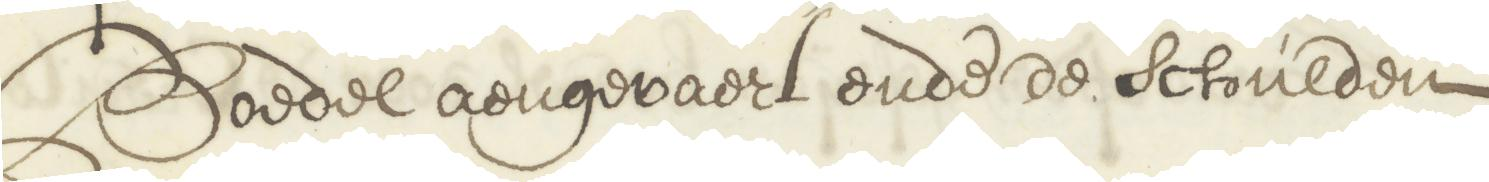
Boedel aengevaert ende de schulden
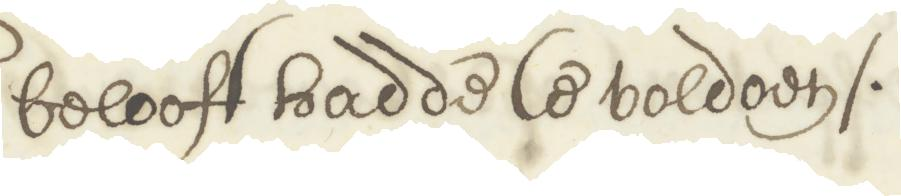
belooft hadde te voldoen/.
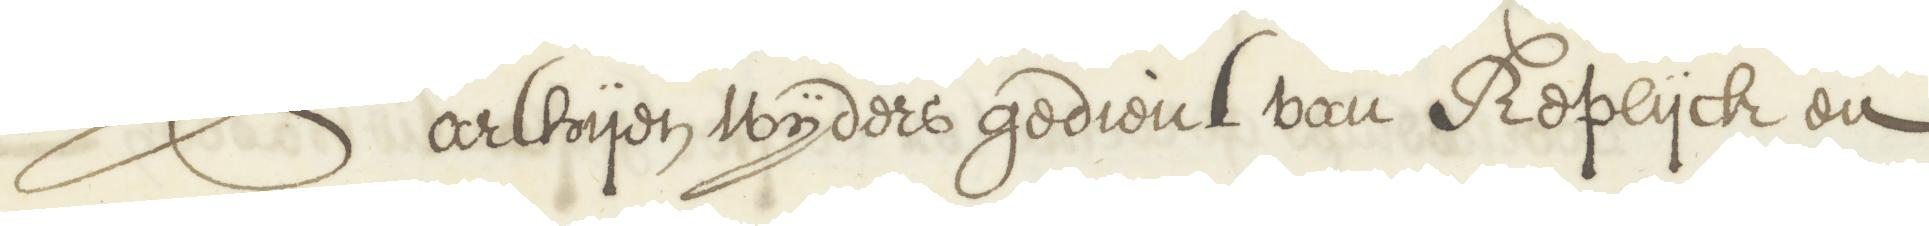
Parthijen wijders gedient van Replijck en
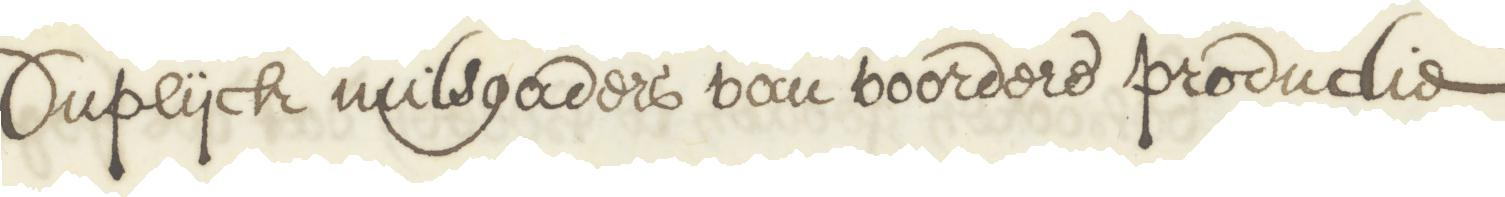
duplijck mitsgaders van voordere productie
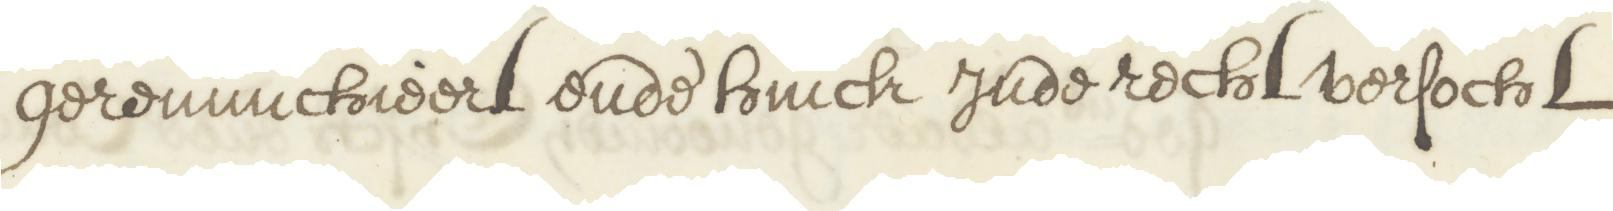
gerenunchieert ende hinck jnde recht versocht
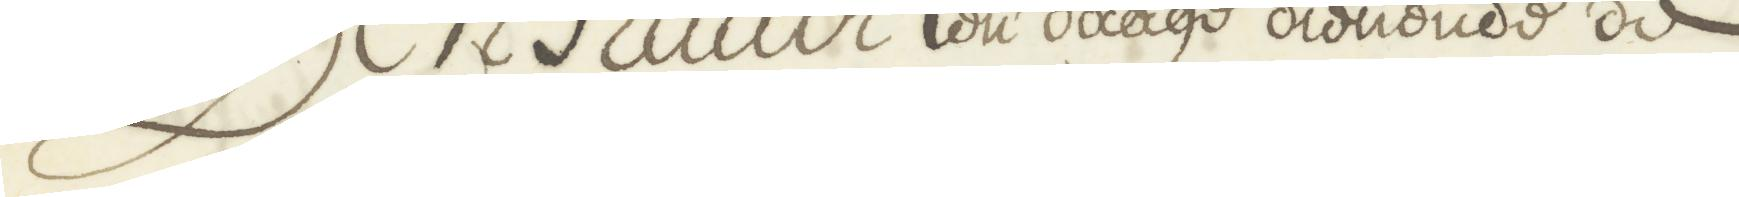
Den Raadt ten daage dienende de
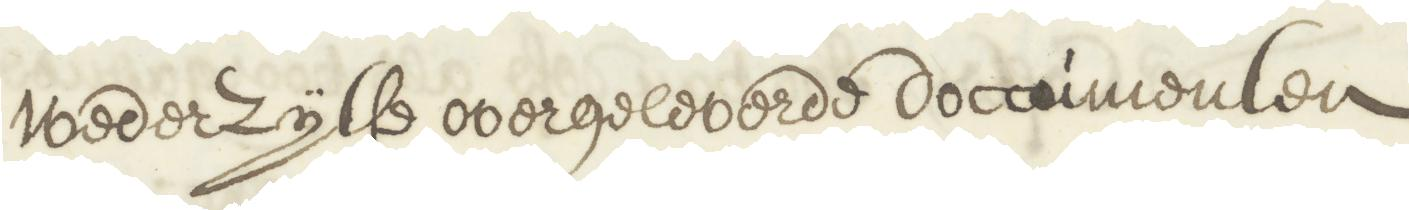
wederzijtse overgeleverde doccumenten
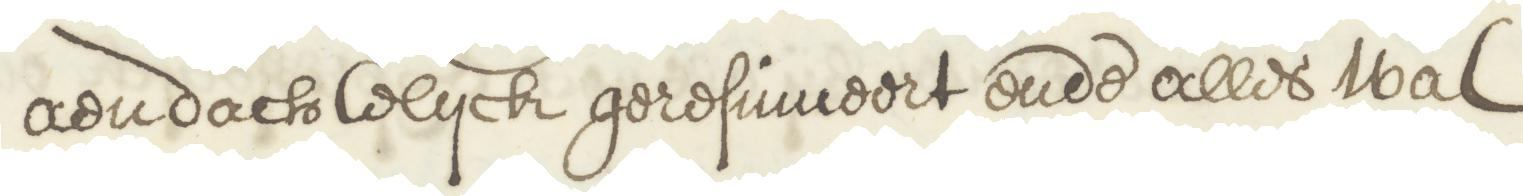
aendachtelijck geresumeert ende alles wat
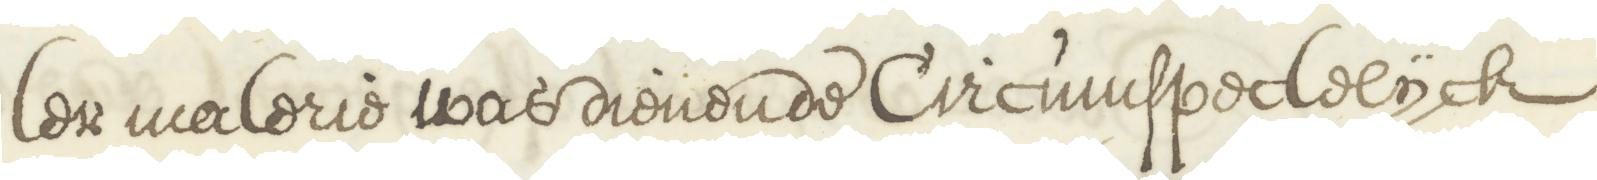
ter materie was dienende Circumspectelijck
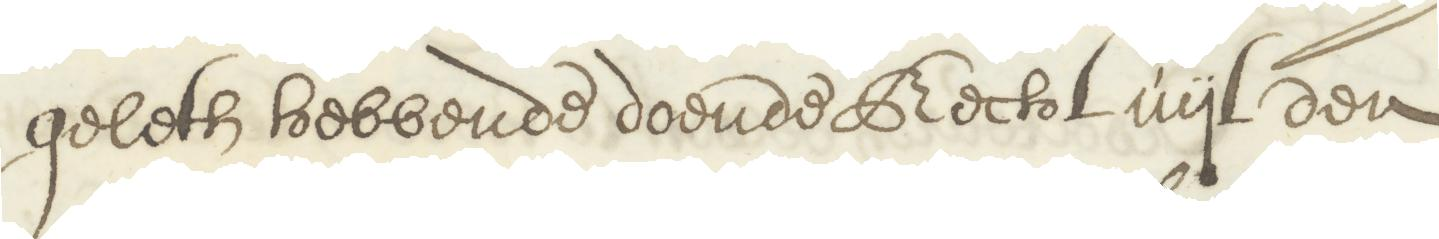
geleth hebbende doende Recht uijt den
